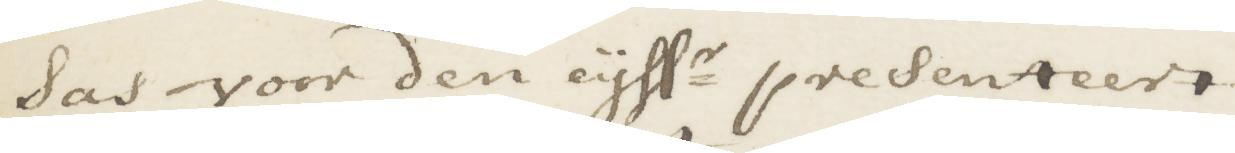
Sas voor den eijss=r presenteert
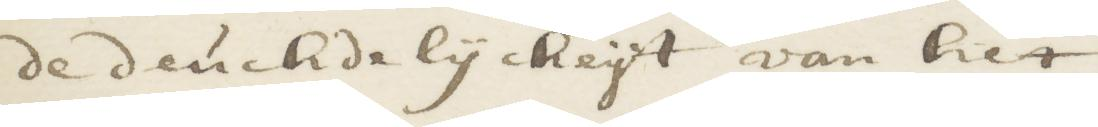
de deuchdelijcheijt van het
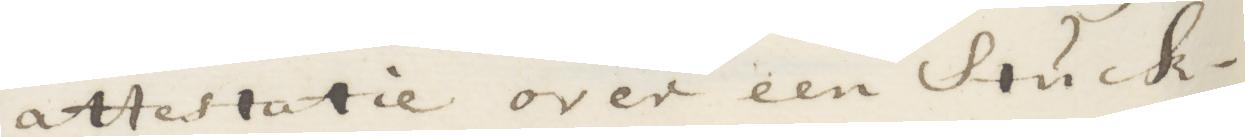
attestatie over een stuck —
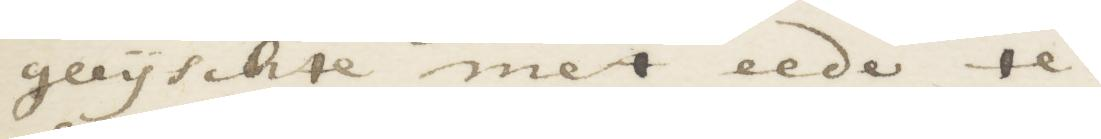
geeijschte met eede te —
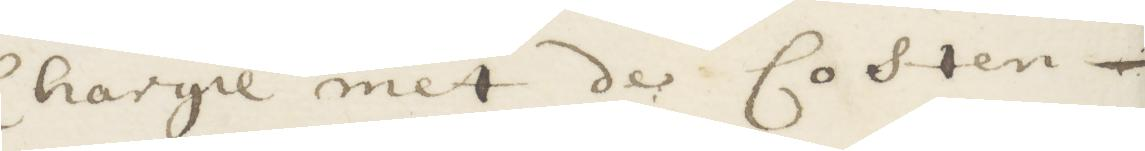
Chargie met de Costen —
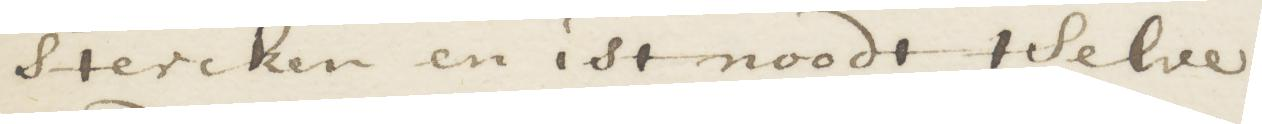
stercken en ist noodt tselve
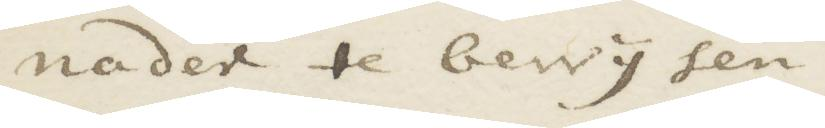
nader te bewijsen
